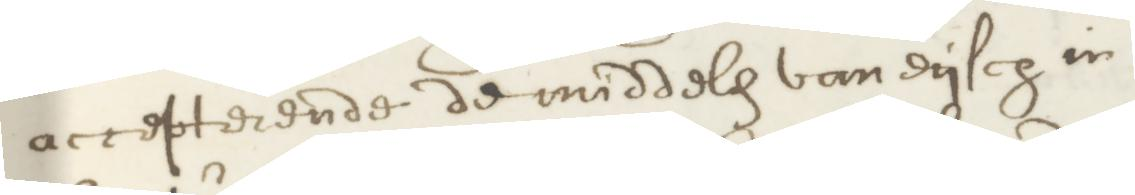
accepterende de middelen van eijsch in
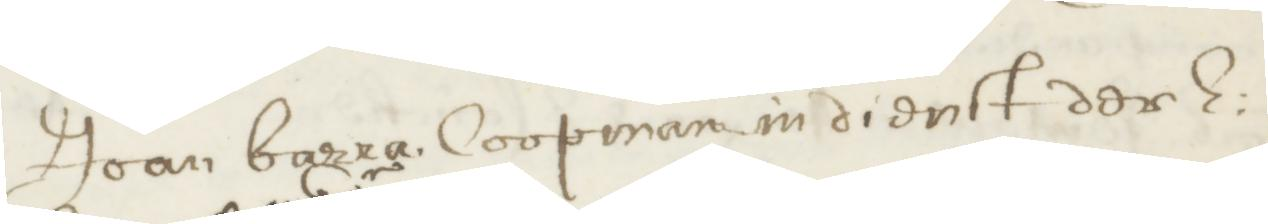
Joan barra Coopman in dienst der E:
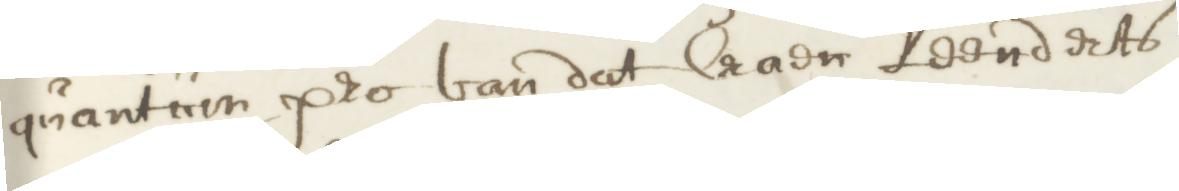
quantum pro van dat Craen Leenderts
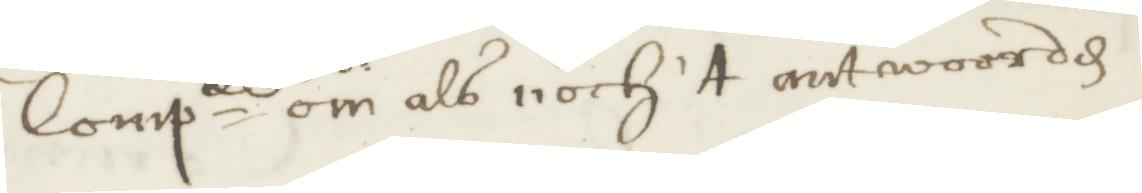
Comp=e om als noch ’t antwoorden
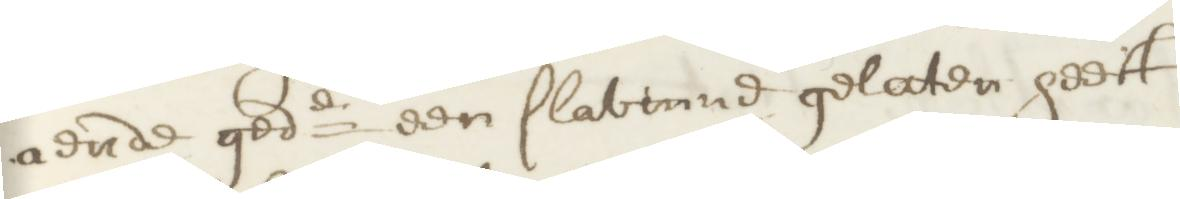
aende ged=e een slavinne gelaten heeft
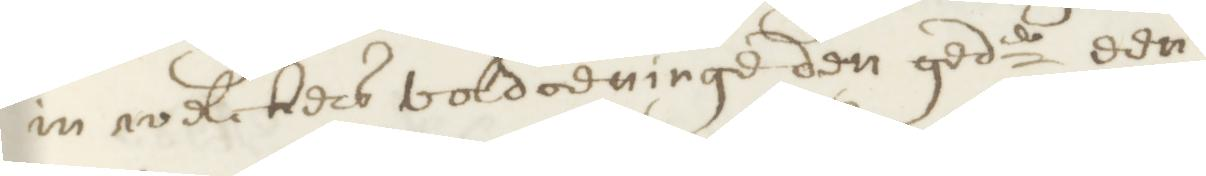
in welckers voldoeninge den ged=e een
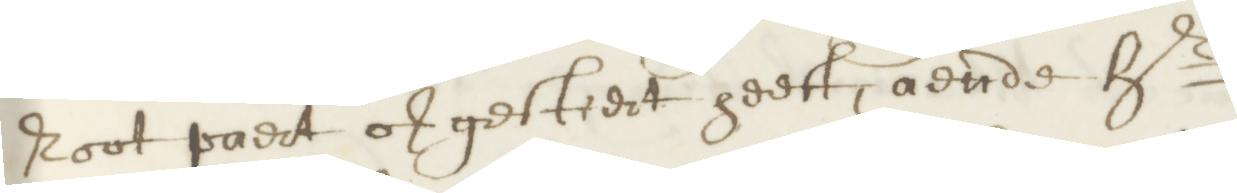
root paert over gestiert heeft, aende H=r
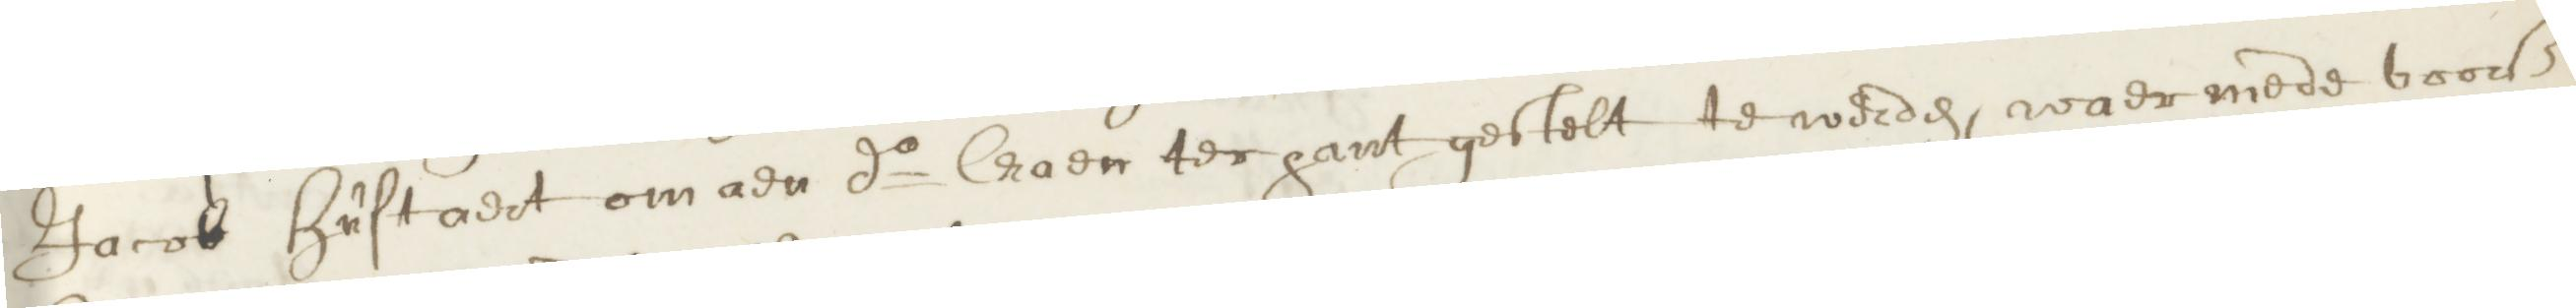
Jacob Hustaert om aen d=o Craen ter hant gestelt te werden, waer mede voors
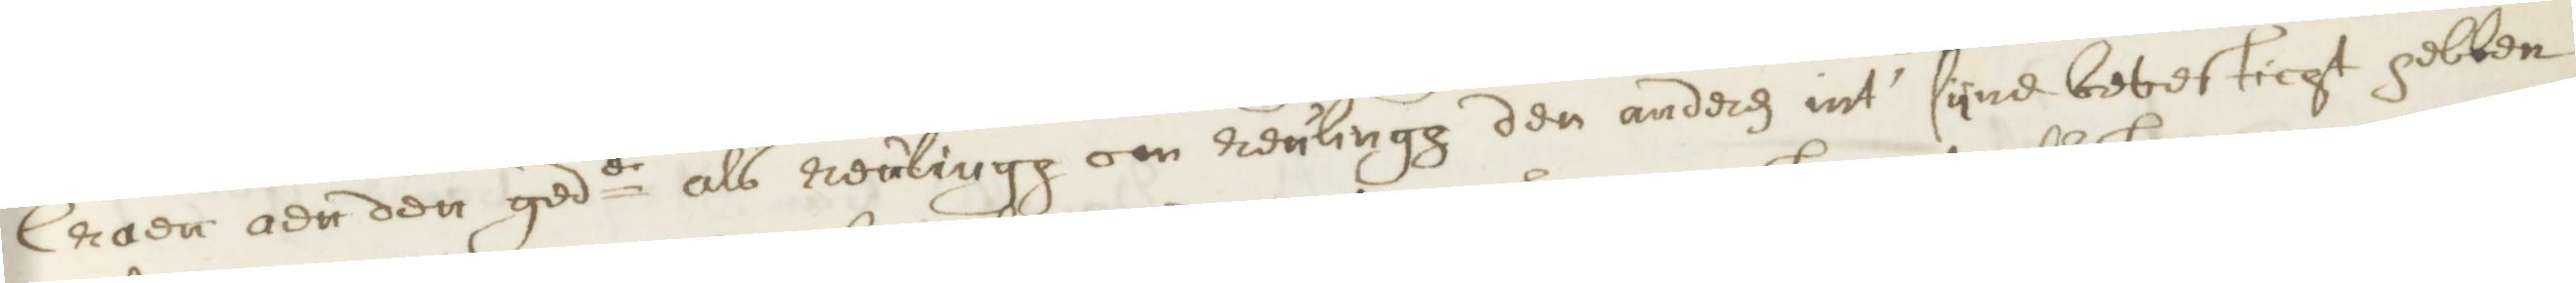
Craen aen den ged=e als reulingh om reulingh den anderen int' sijne bevesticht hebben
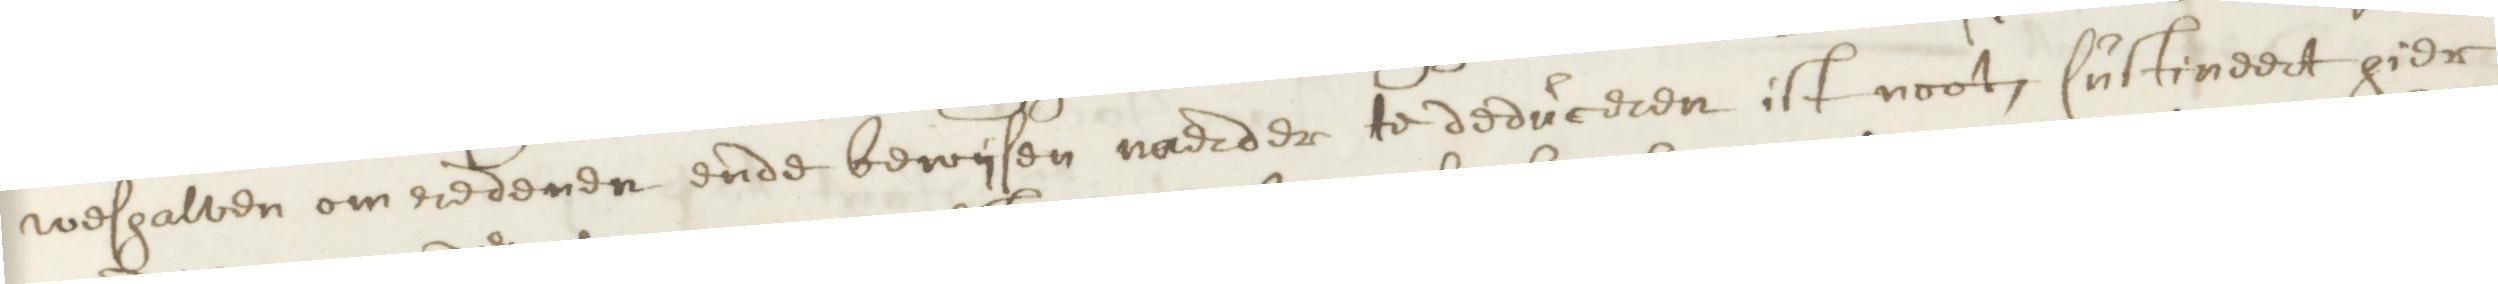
weshalven om redenen ende bewijsen naerder te deduceren ist noot, sustineert hier
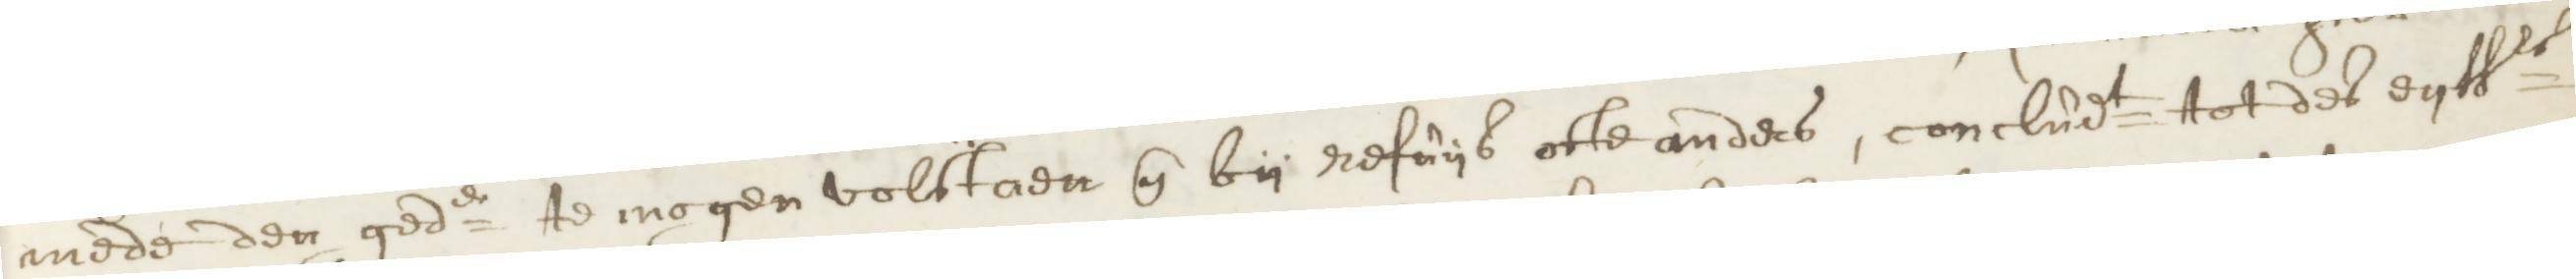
mede den ged=e te mogen volstaen ende bij refuijs ofte anders, conclud=t tot des eyss=rs
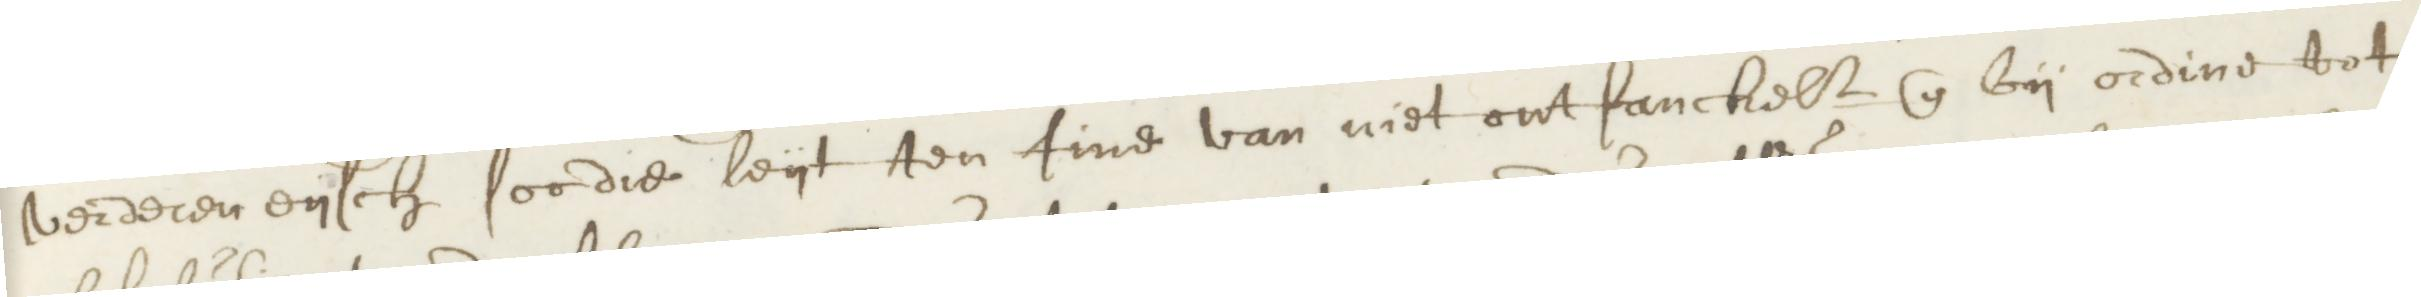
verderen eijsch soo die leijt ten fine van niet ontfanckelijk ende bij ordine tot
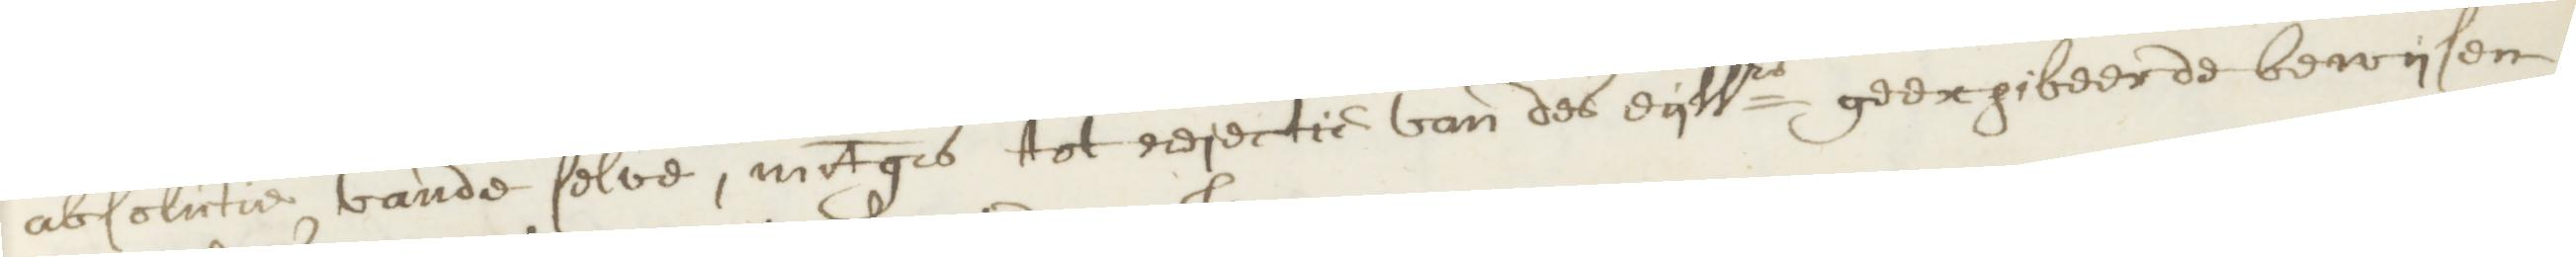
absolutie vande selve, mitgrs tot rejectie van des eijss=rs geexhibeerde bewijsen
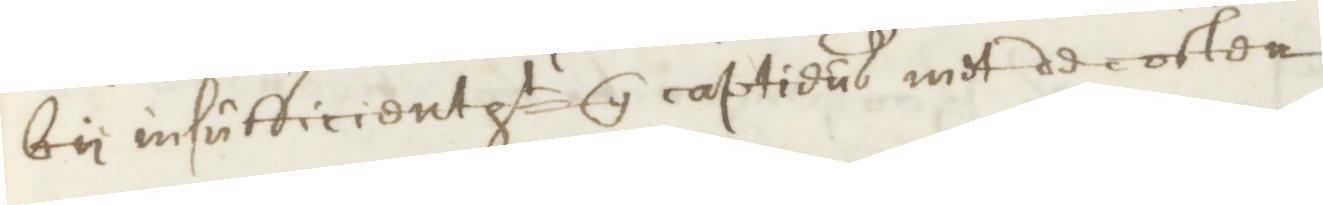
bij insufficienth=t ende captieus met de costen
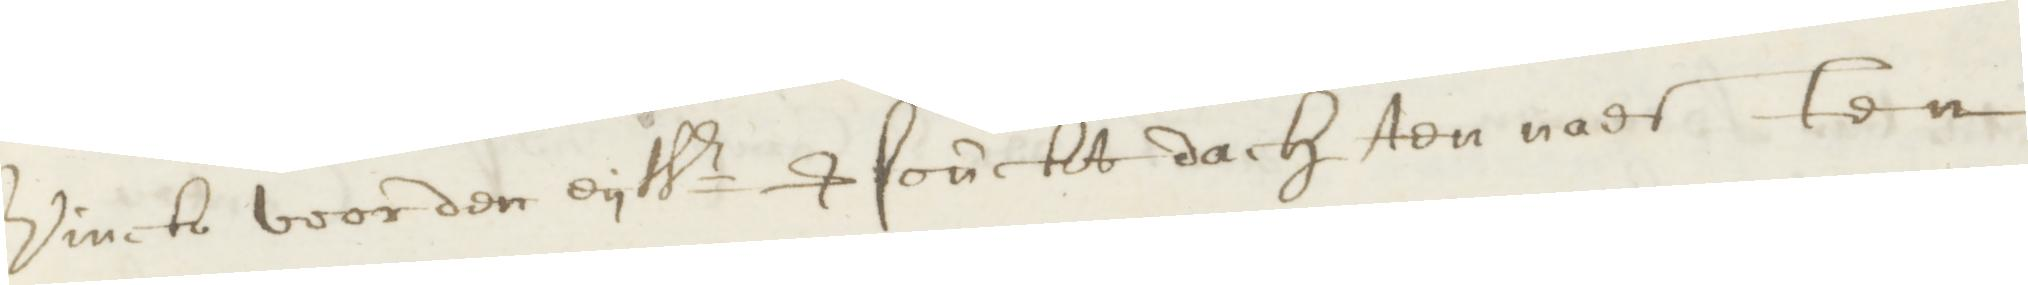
Vinck voor den eijss=r versouckt dach ten naesten
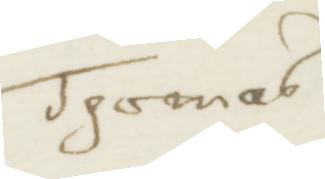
Thomas
